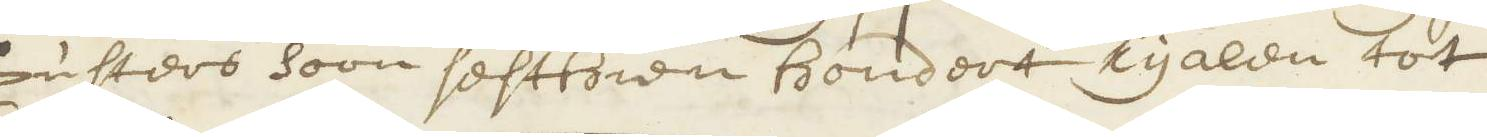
Susters soon sesthien hondert rijalen tot
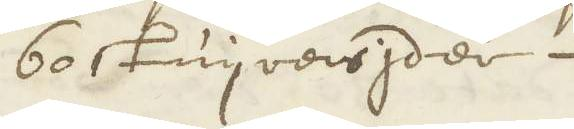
60 stuijvers jder -
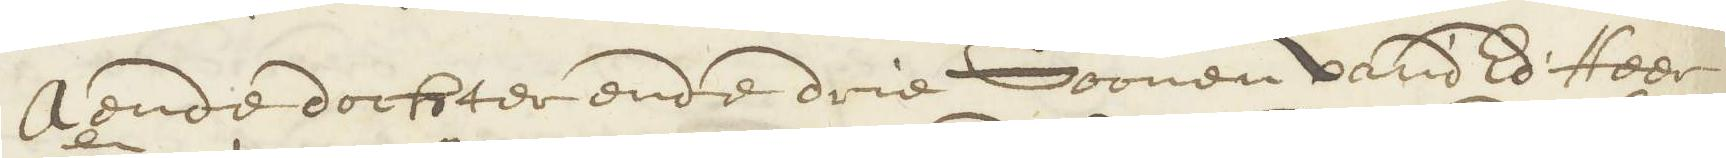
Aende dochter ende drie Soonen vand' Ed' Heer
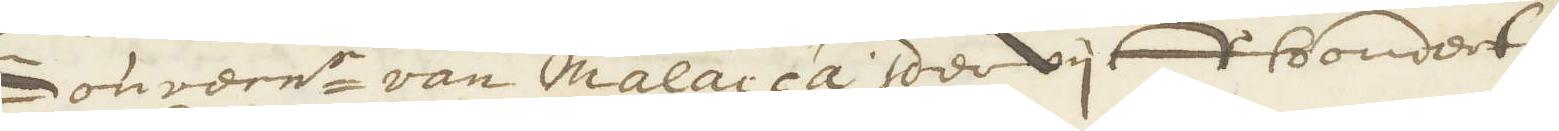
Gouvern=r van Malacca jder vijf Hondert
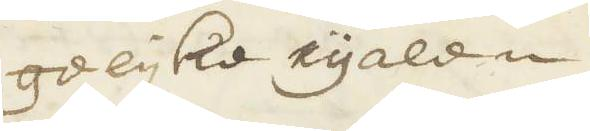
gelijke rijalen
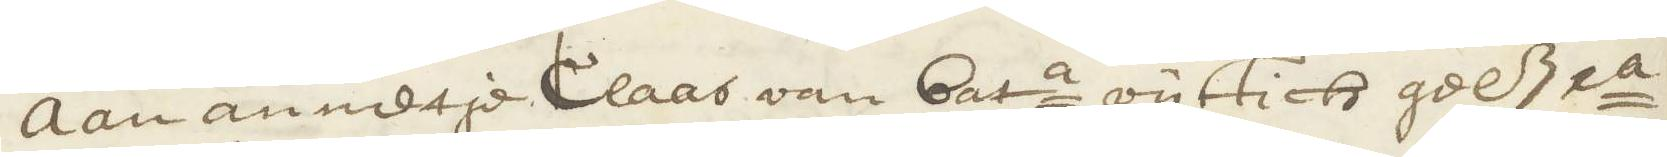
Aan annetje Claas van bat=a vijftich gelijk r=a
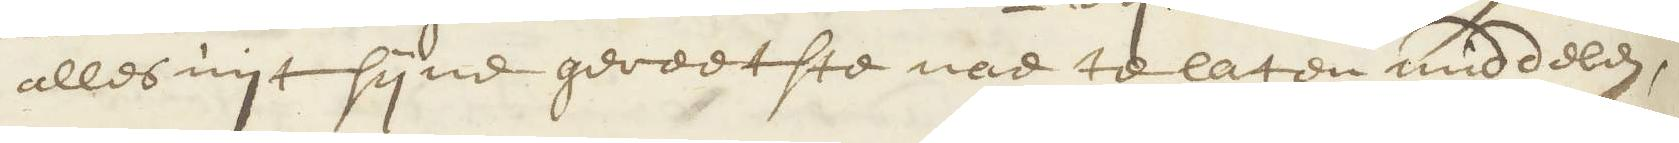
alles uijt sijne gereetste nae te laten middelen,
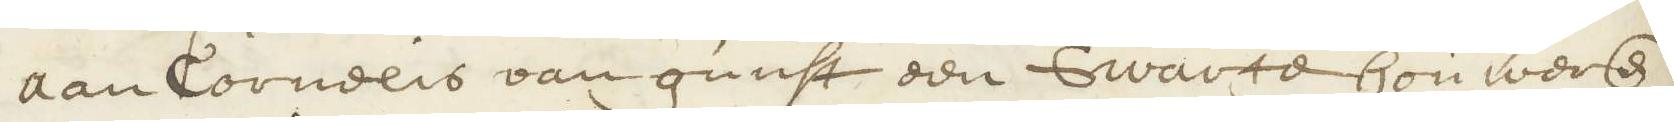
aan Cornelis van gunst een swarte houwer ende
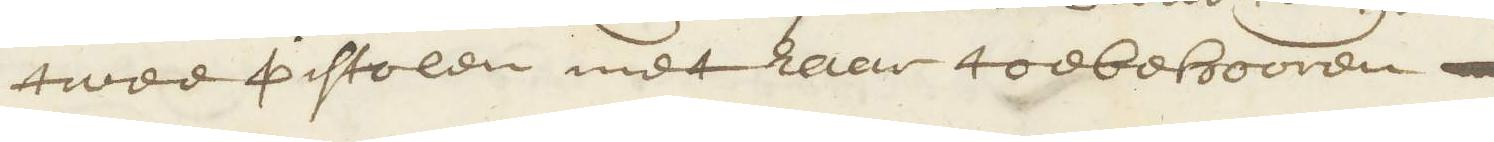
twee pistolen met haar toebehooren —
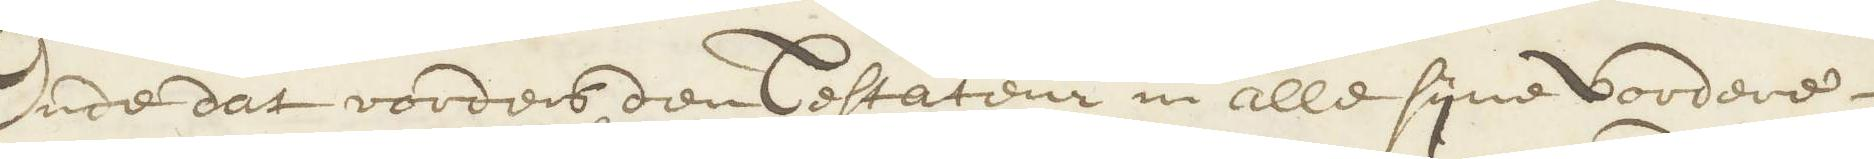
Ende dat vorders den Testateur in alle sijne vordere -
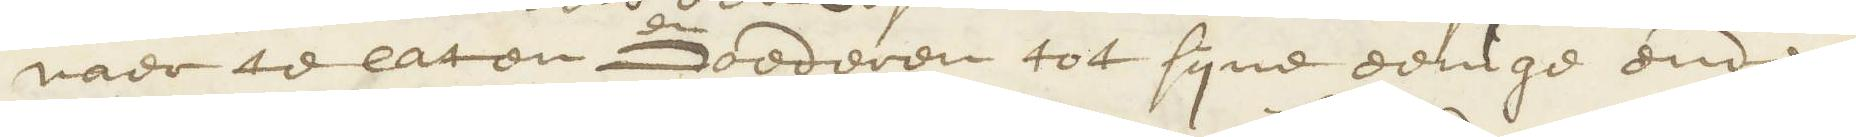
naer te laten Goederen tot sijne eenige ende
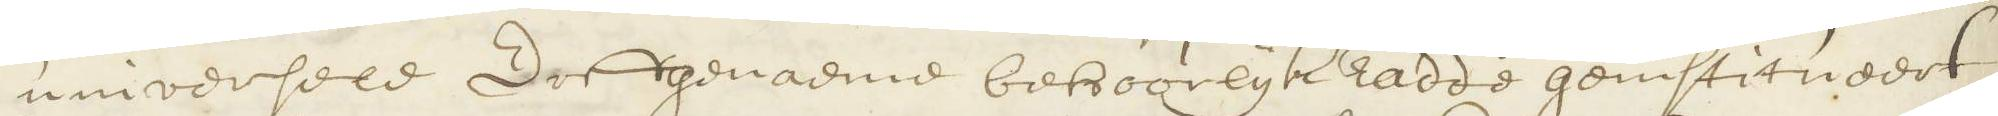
universele Erftgenaeme behoorlijk hadde geinstitueert
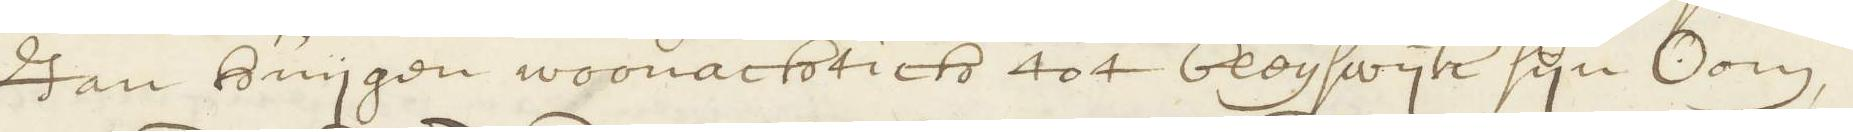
Jan huijgen woonachtich tot bleijswijk sijn Oom„
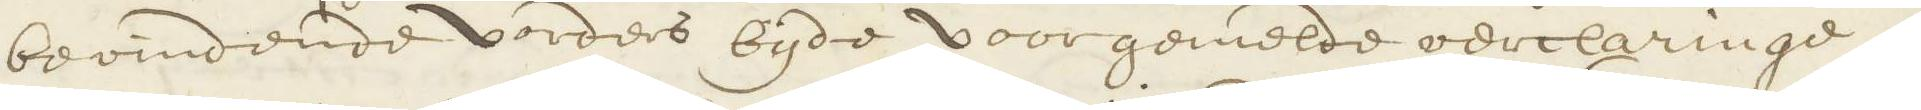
bevindende vorders bijde voorgemelde verclaringe —
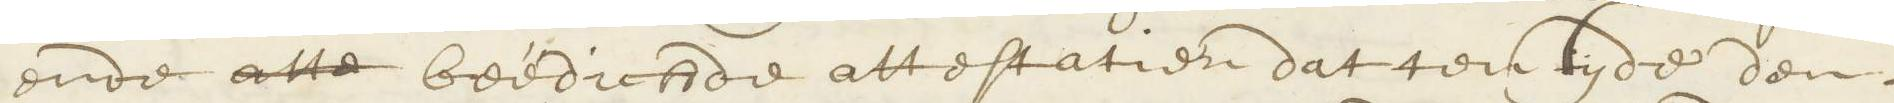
ende atte beedichde attestatien dat ten tijde den
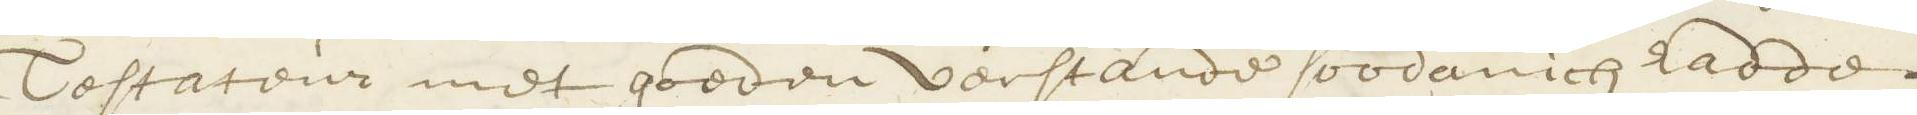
Testateur met goeden verstande soodanich hadde
